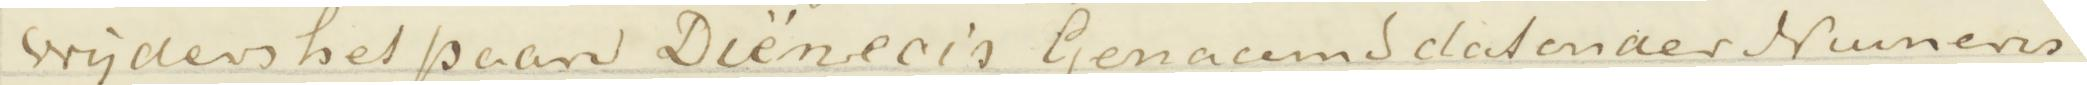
wijders het paard Diënecis Genaamd dat onder Numeris
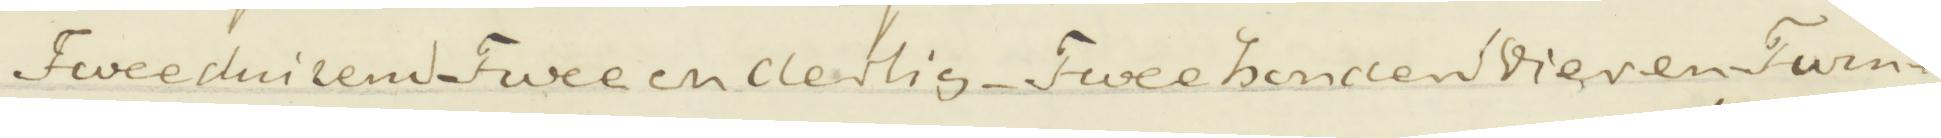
Tweeduizend Twee en dertig - Twee honderd Vier en Twin„
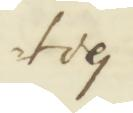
„tig
